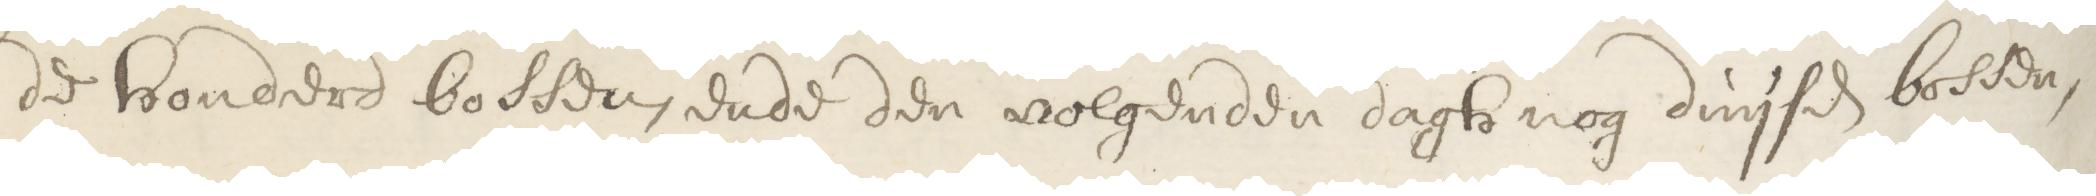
de honderd bossen, ende den volgenden dagh nog duijsen bossen,
